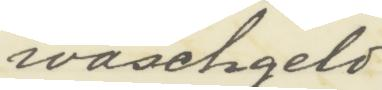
waschgeld
